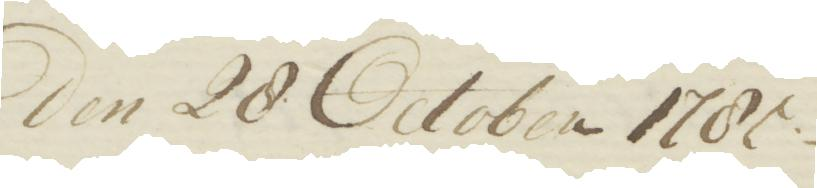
den 28. October 1785.
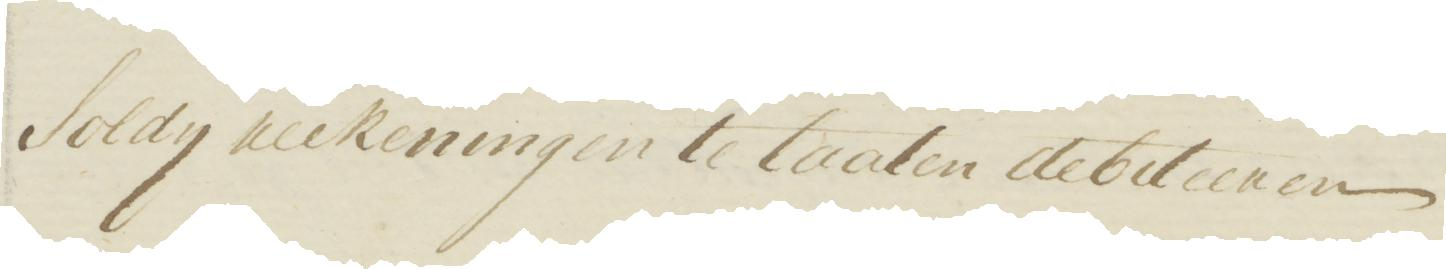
soldy reekeningen te laaten debiteeren
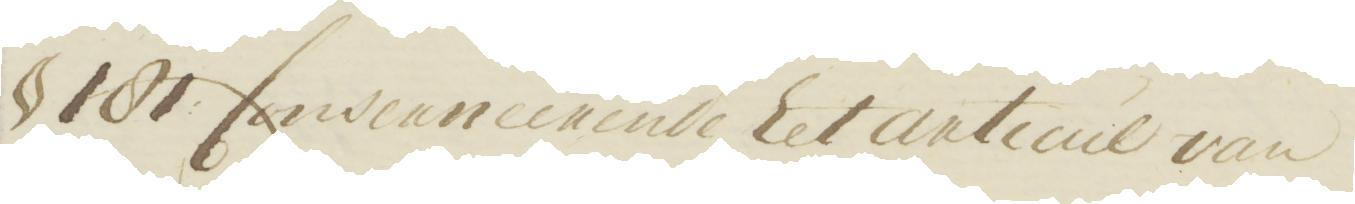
§ 181: Conserneerende het articul van
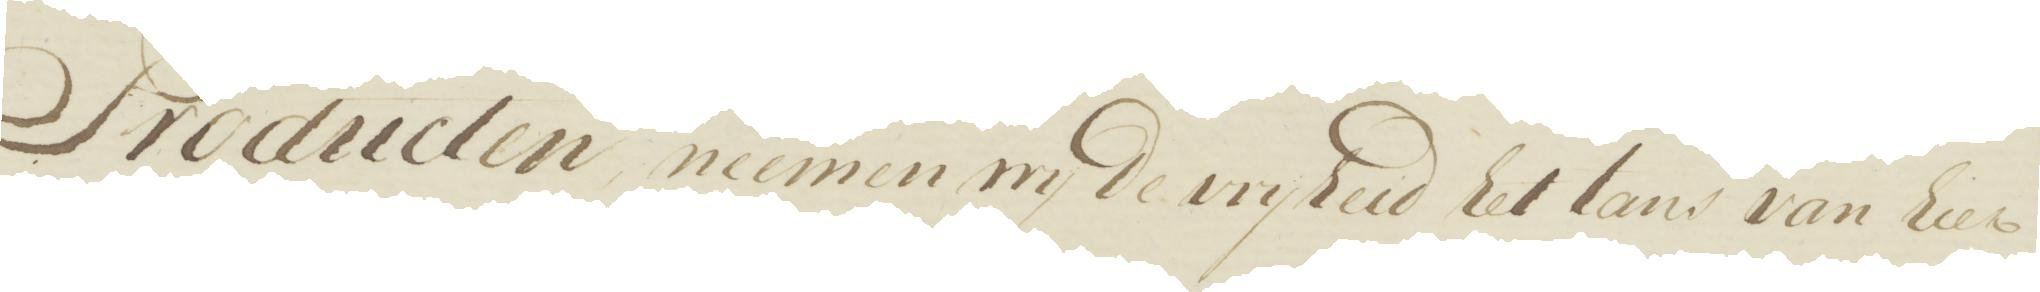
Producten, neemen wij de vrijheid het tans van hier
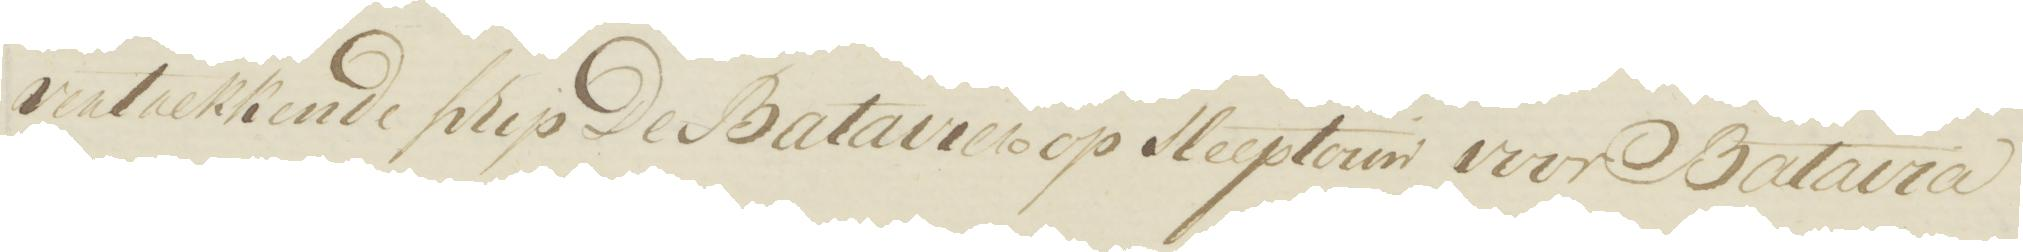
vertrekkende schip De Batavier op sleeptouw voor Batavia
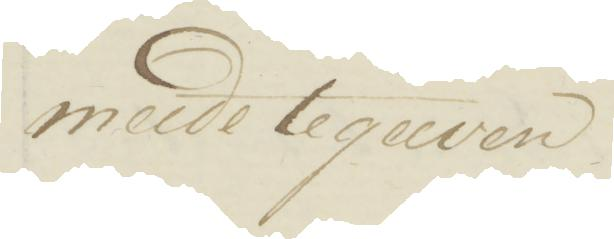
meede te geeven
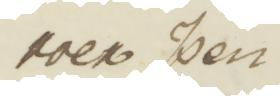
roer pen
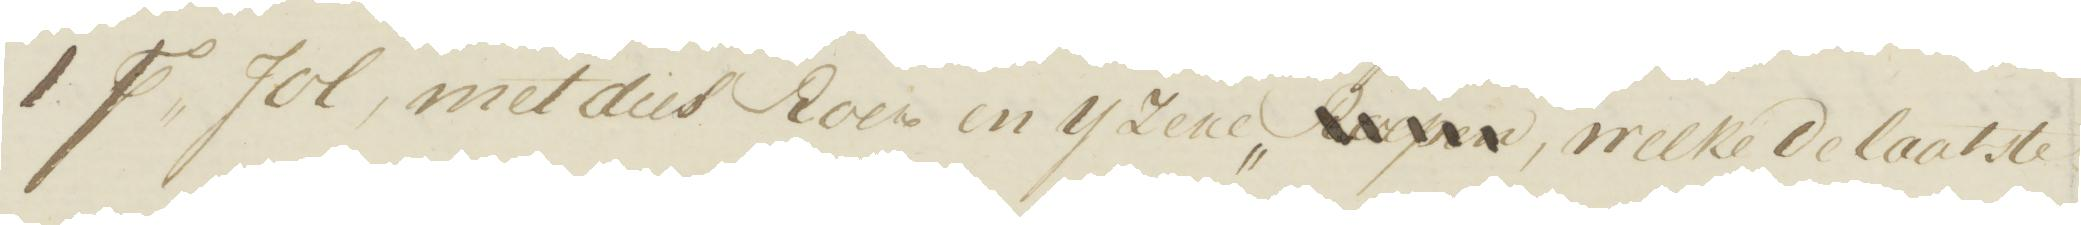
1: p„s Jol, met dies Roer en yzere„ welke de laatste
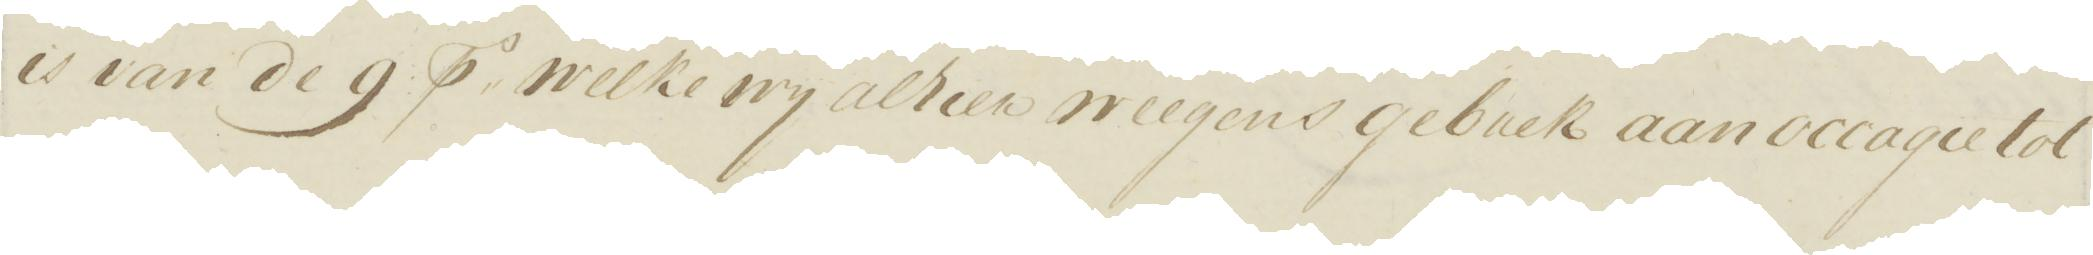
is van de 9: p„s welke wij alhier weegens gebrek aan occagie tot
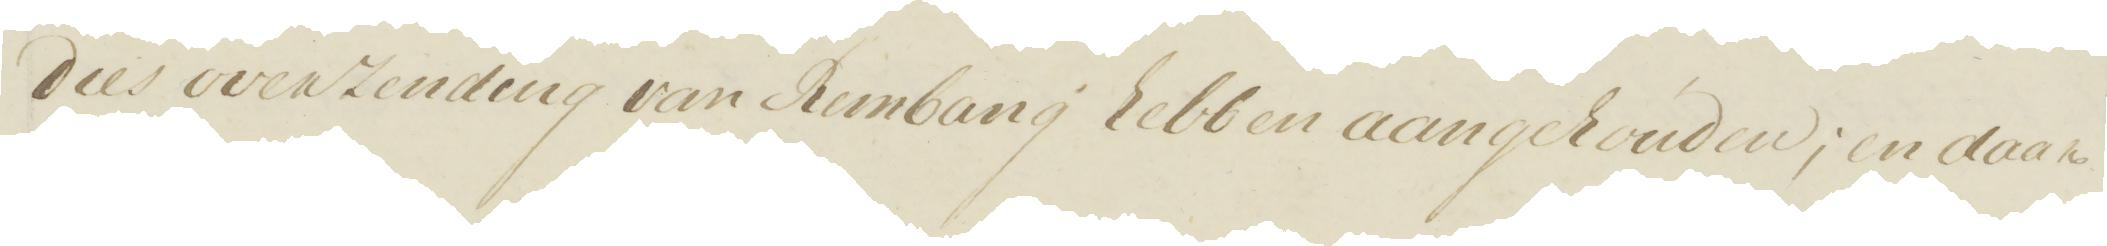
dies overzending van Rembang hebben aangehouden; en daar
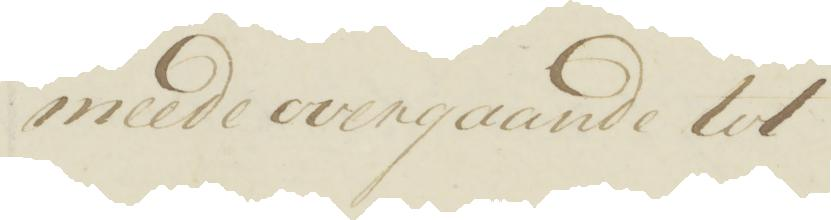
meede overgaande tot
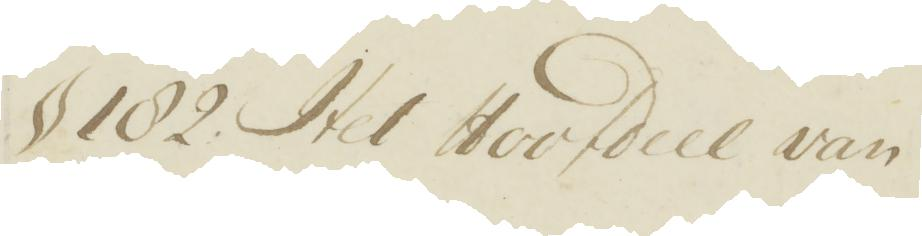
§ 182. Het Hoofdeel van
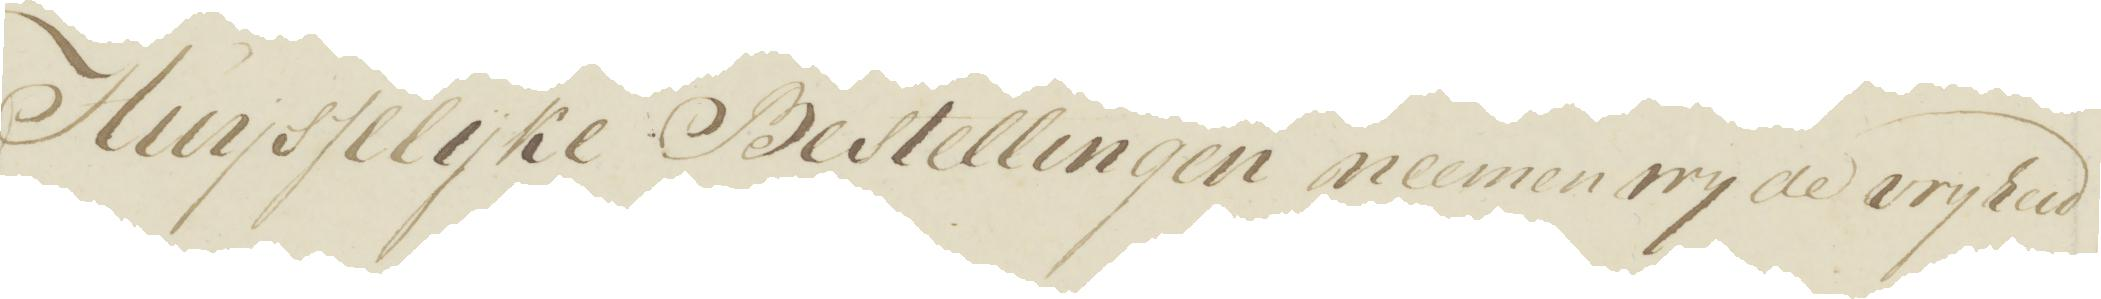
Huysselyke Bestellingen neemen wy de vryheid
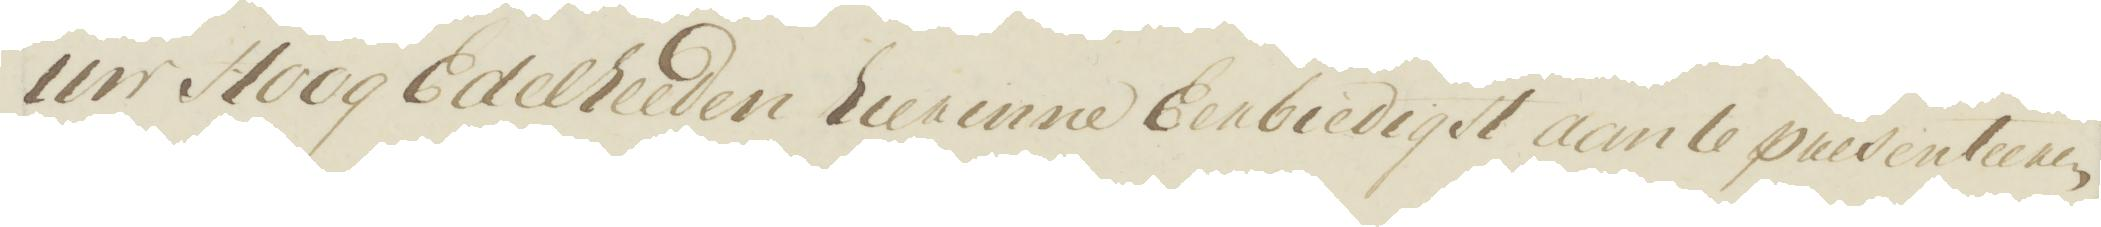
uw Hoog Edelheeden hierinne Eerbiedigst aan te presenteeren
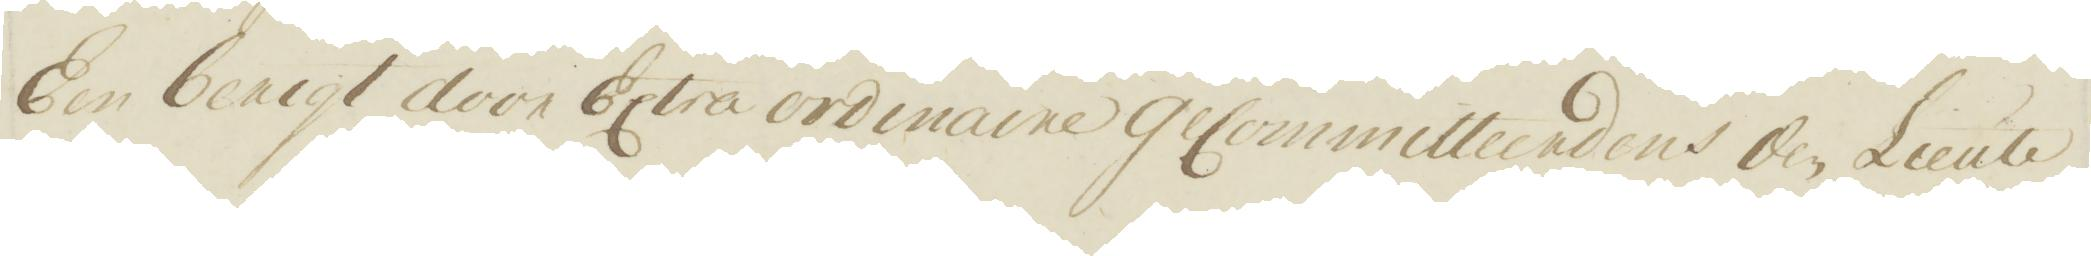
Een berigt door Extra ordinaire gecommitteerdens den Lieute
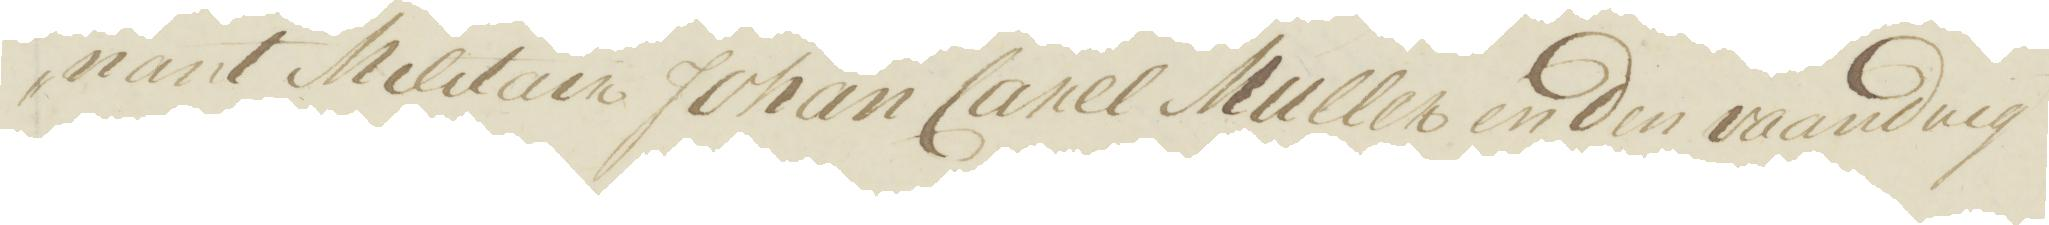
„nant Militair Johan Carel Muller en den vaandrig
